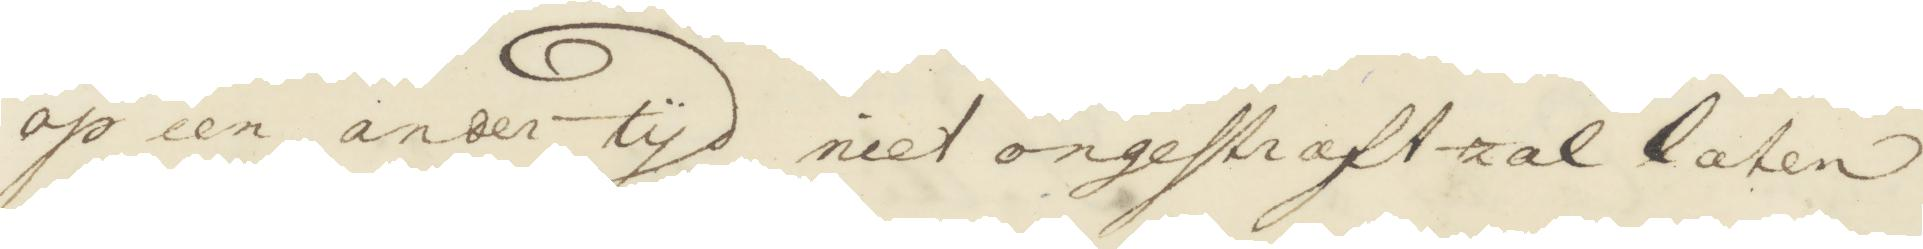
op een ander tijd niet ongestraft zal laten
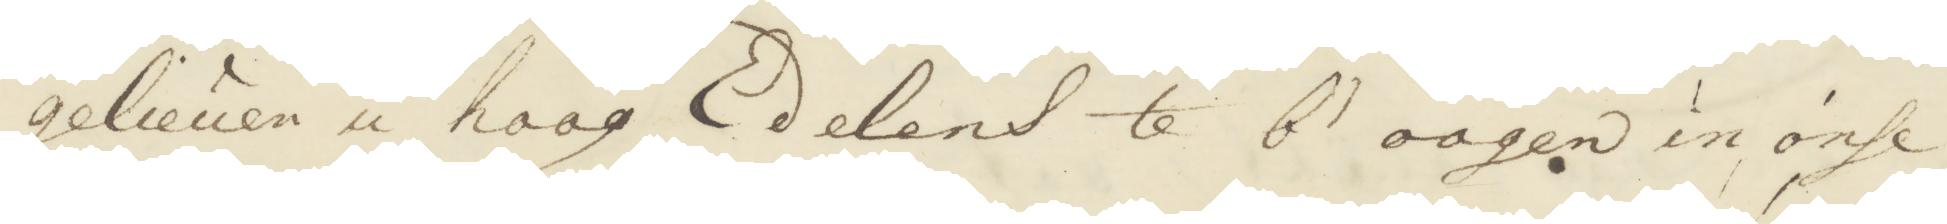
gelieven u hoog Edelens te b' oogen in onse
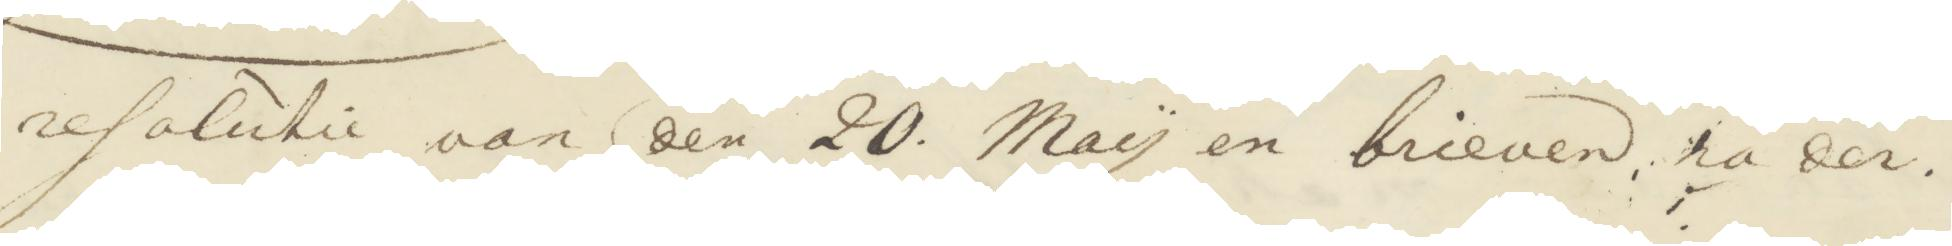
resolutie van den 20. Maij en brieven, na der.
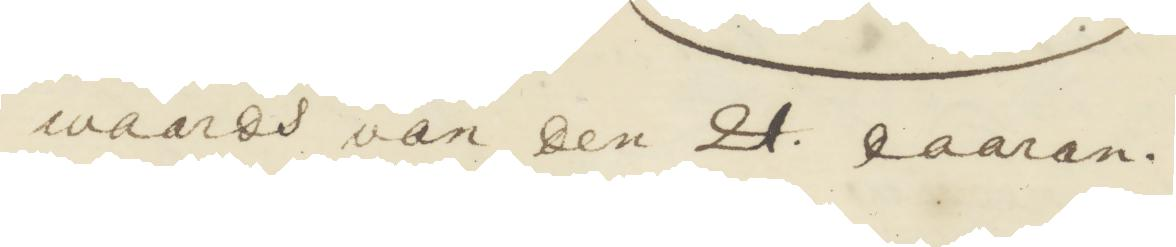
waards van den 21. daaran.
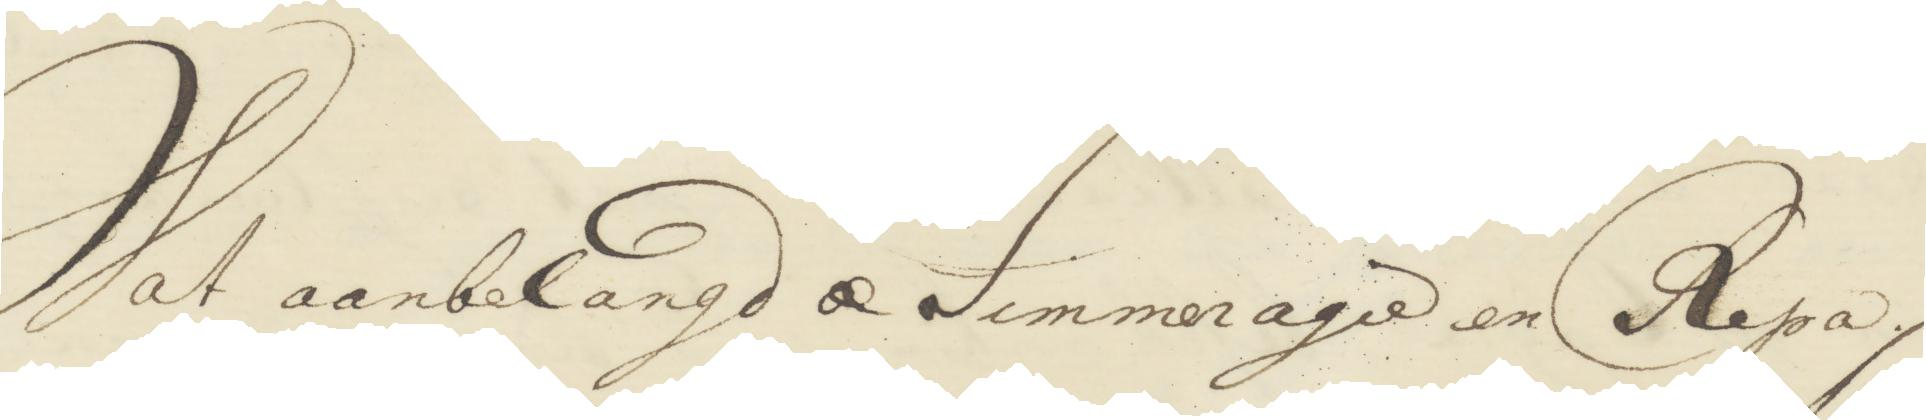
Wat aanbelangd de Timmeragie en Repa.
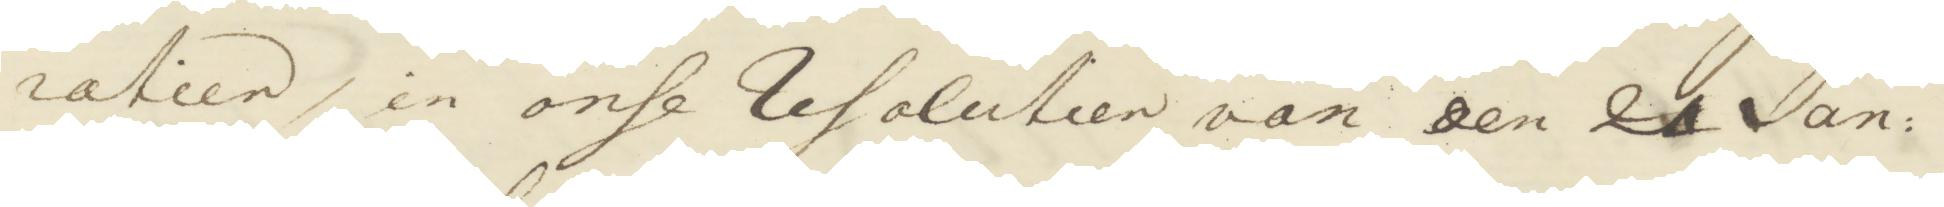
ratien, in onse resolutien van den 20 Ian:
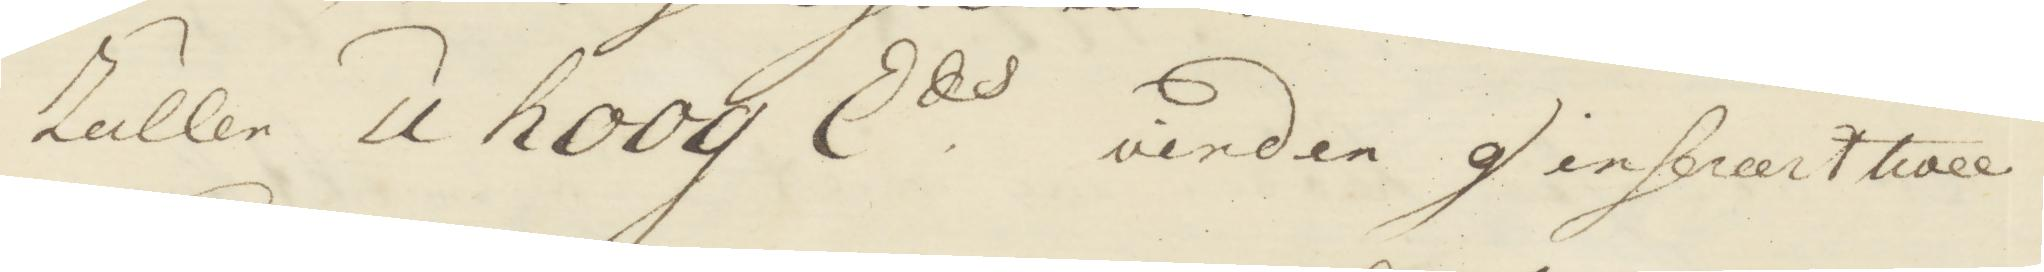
zullen u hoog E.ds verder g’insereert twee
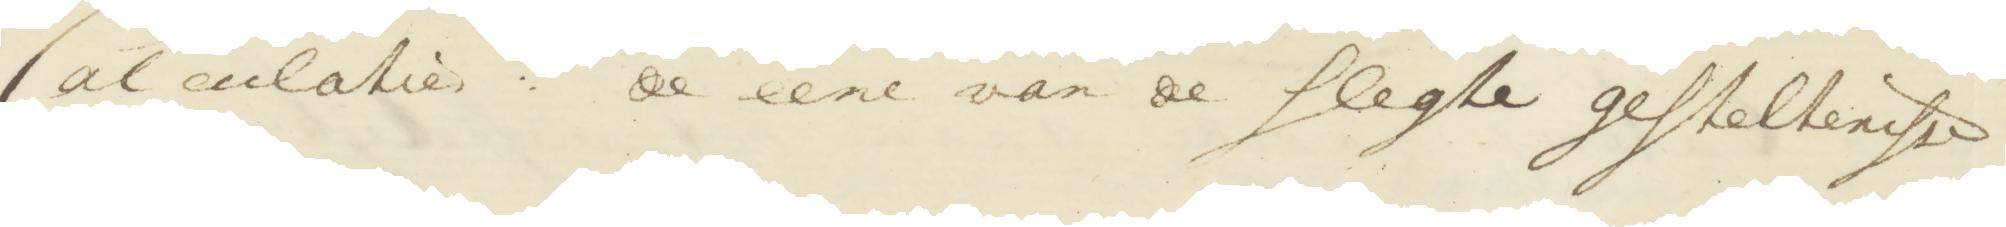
Calculatien: de eene van de slegte gesteltenisse
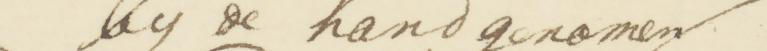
bij de hand genomen
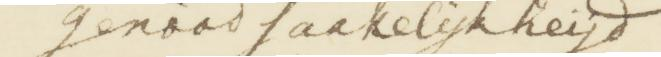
genood saakelijkheijd
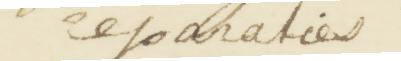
reparaties
